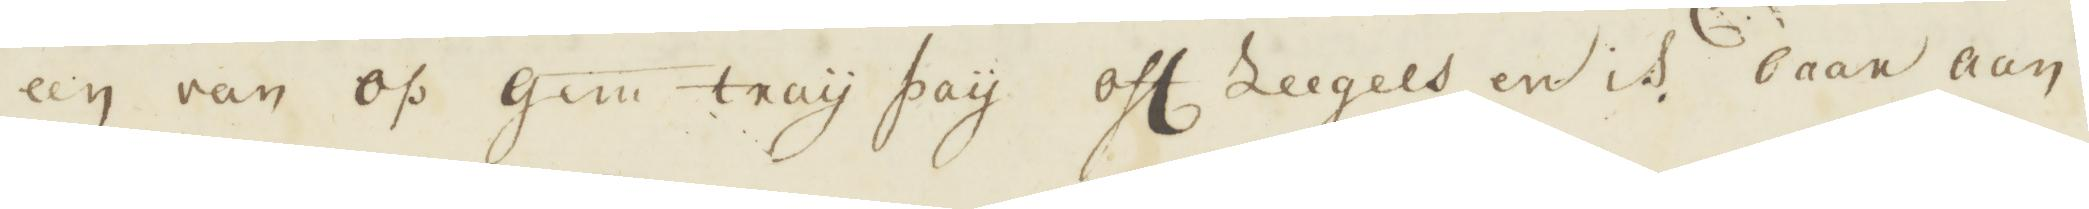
een van op gem traij paij off zeegels en is, daar aan
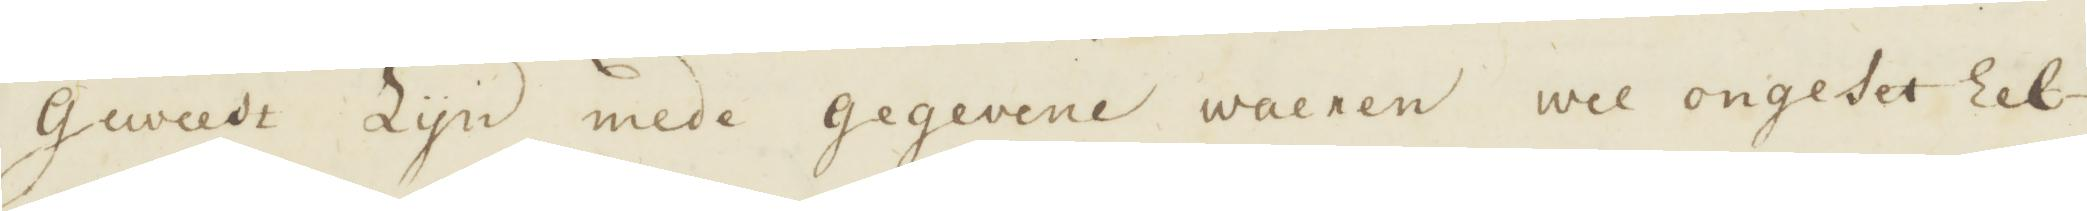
geweest zijn mede gegevene waeren wel ongeset heb-
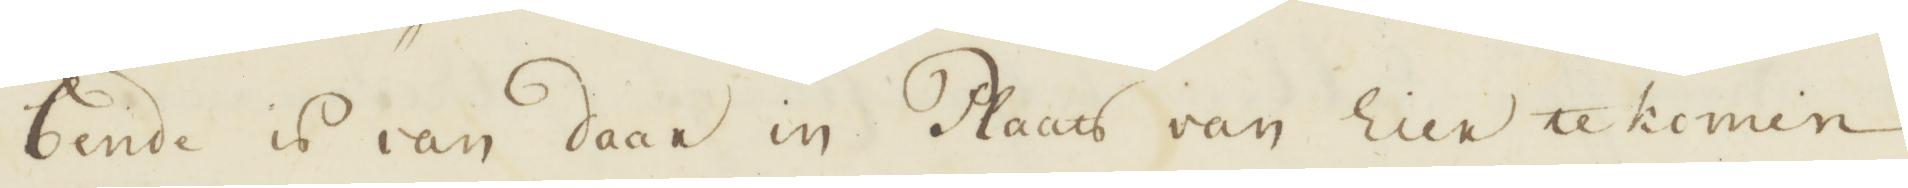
bende is van daar in Plaats van hier te komen
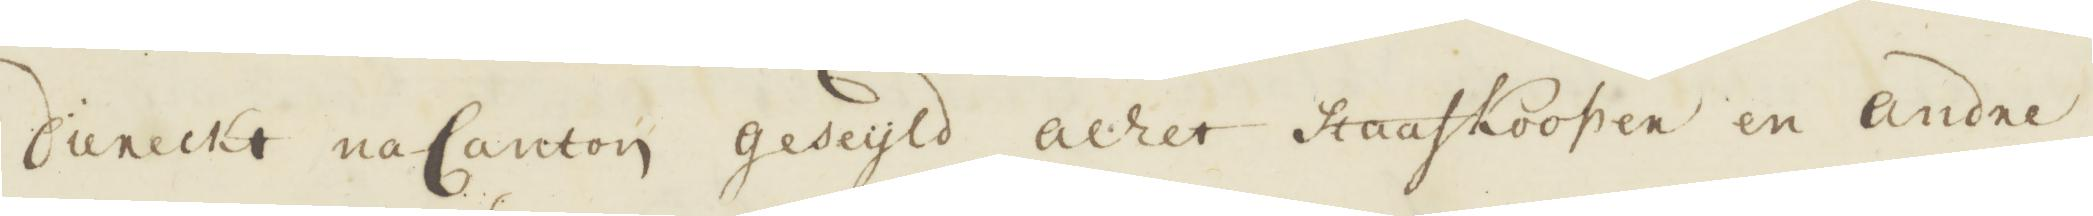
diereckt na Canton geseijld alhet staafkooper en andre
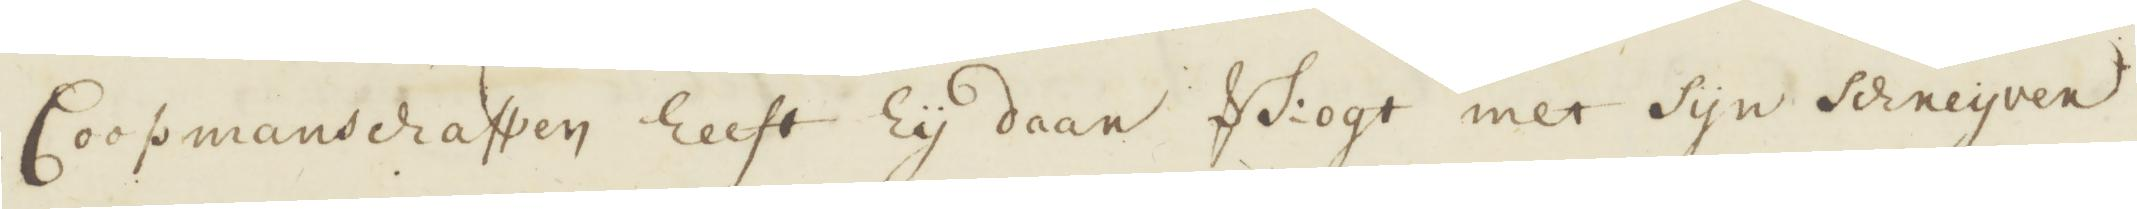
Coopmanschappen heeft hij daar verkogt met sijn schreijver
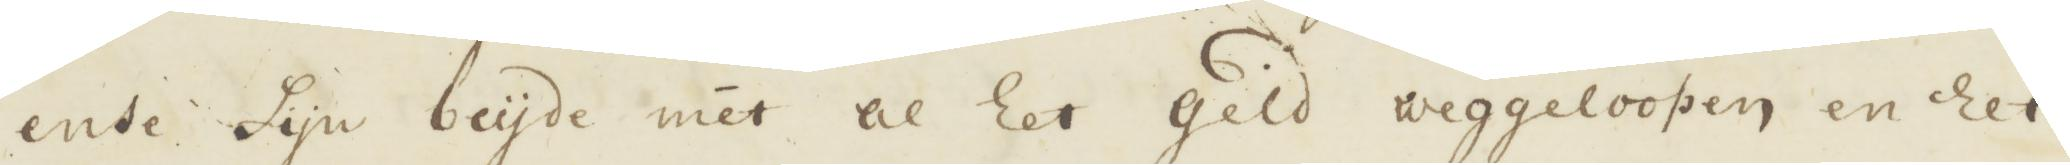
ense sijn beijde met al het geld weggeloopen en het
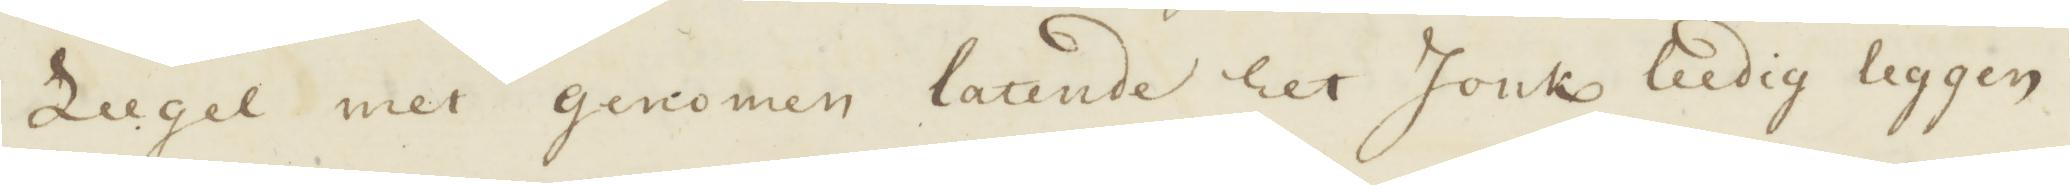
zeegel met genomen latende het Jonk leedig leggen
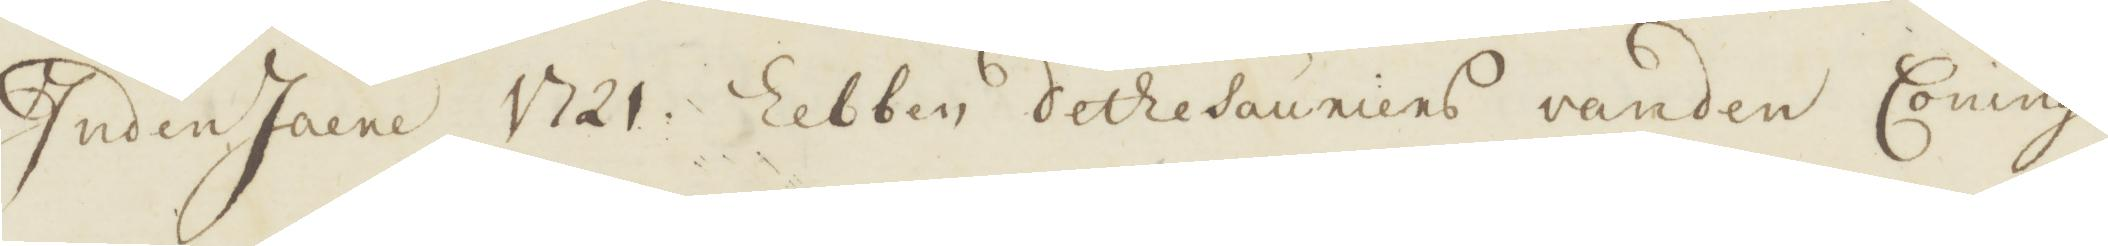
Jnden Jaere 1721. hebben de thesauriers van den Coning
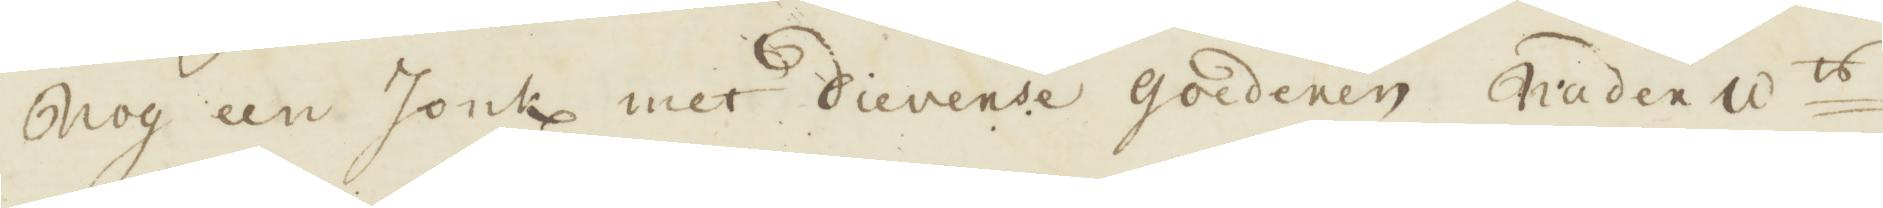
nog een Jonk met dieverse goederen nader w=ts
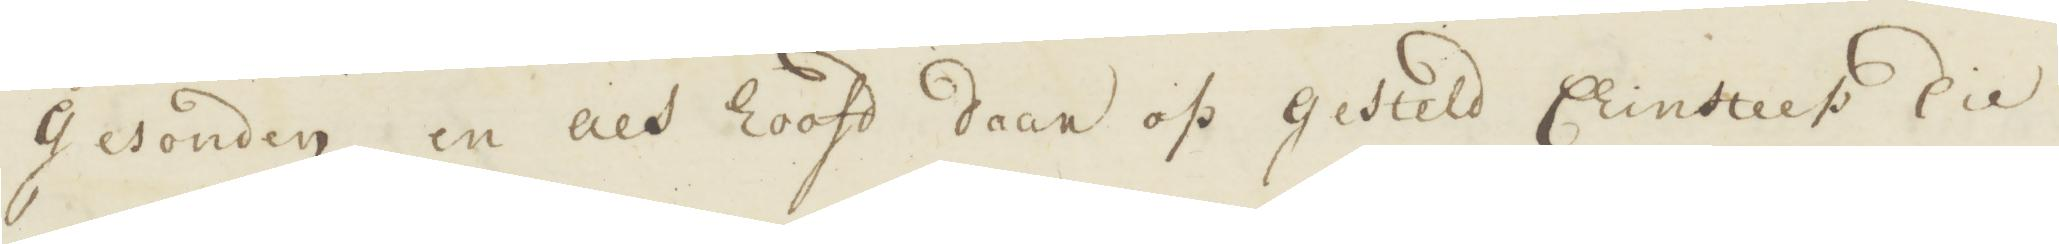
gesonden en als hoofd daar op gesteld Chinsteep die
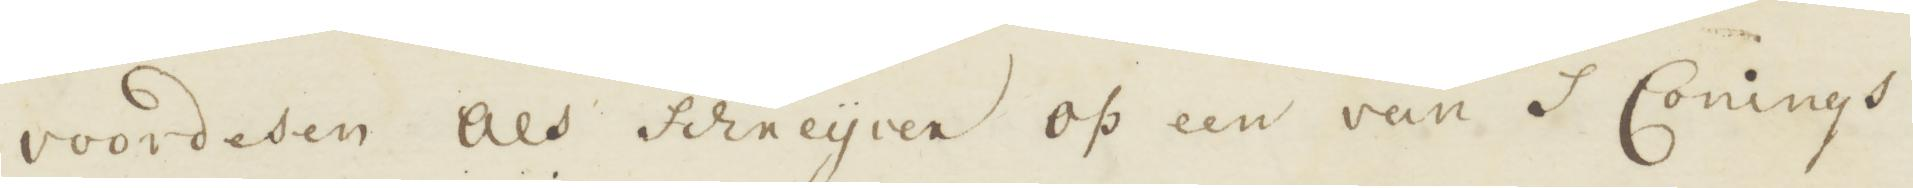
voordesen als schreijver op een van 's Conings
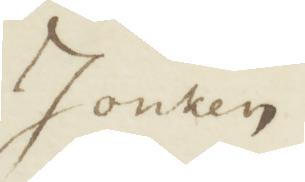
Jonken
